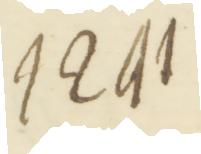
1241
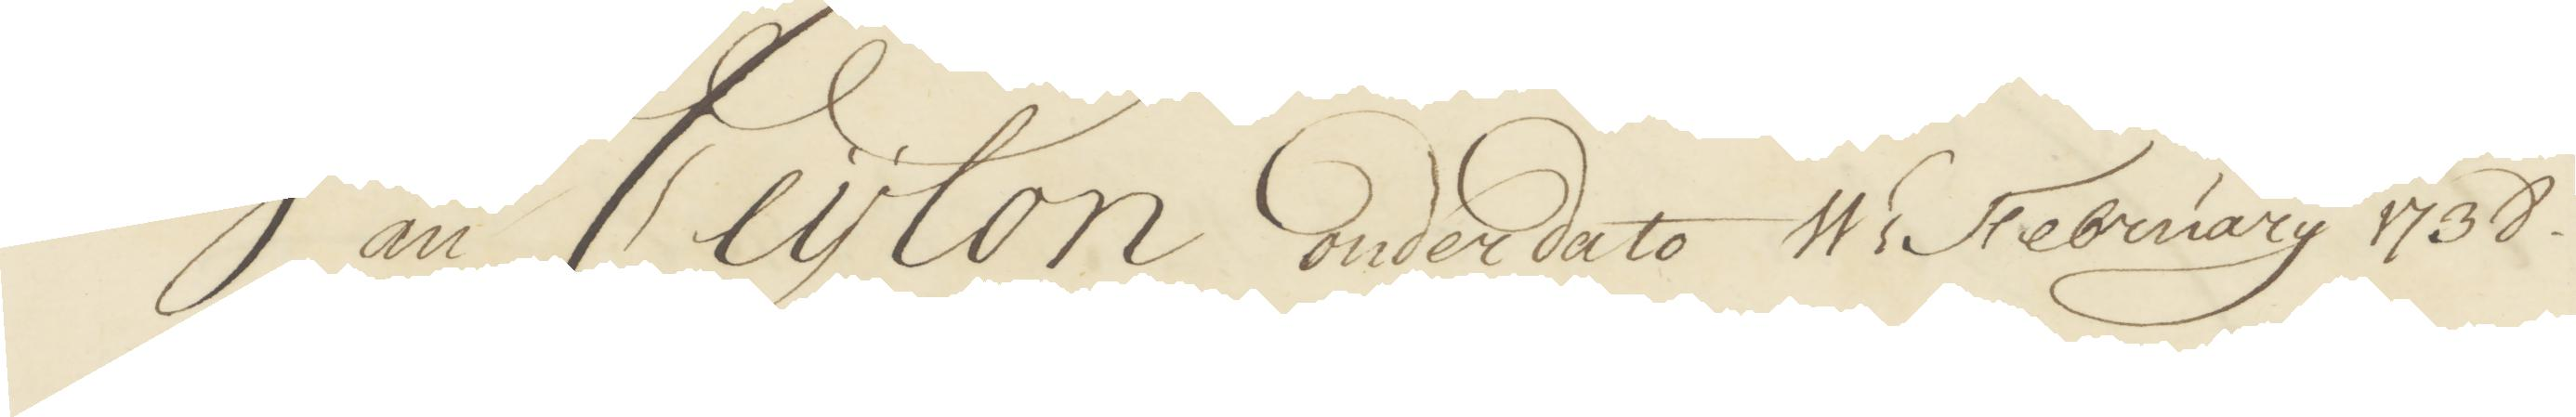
Van Ceijlon onder dato 11:' Februarij 1738.
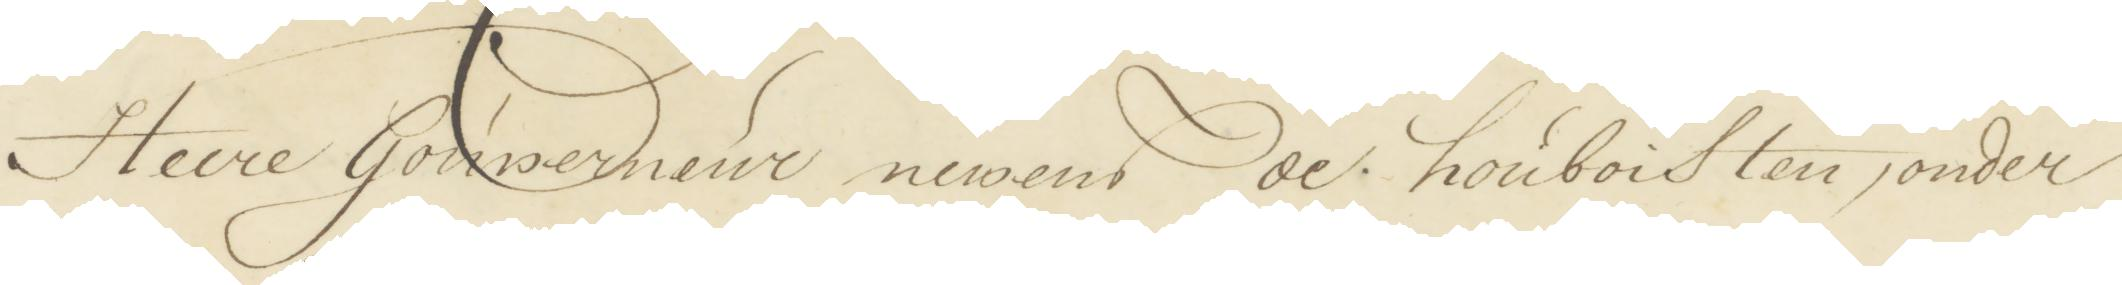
Heere Gouverneur nevens de houboisten, onder
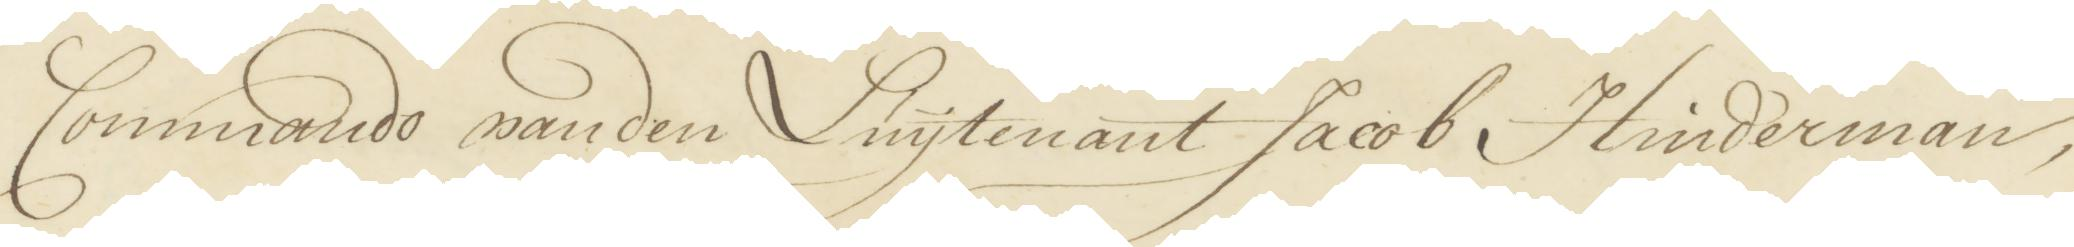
Commando van den Luijtenant Jacob Hinderman,
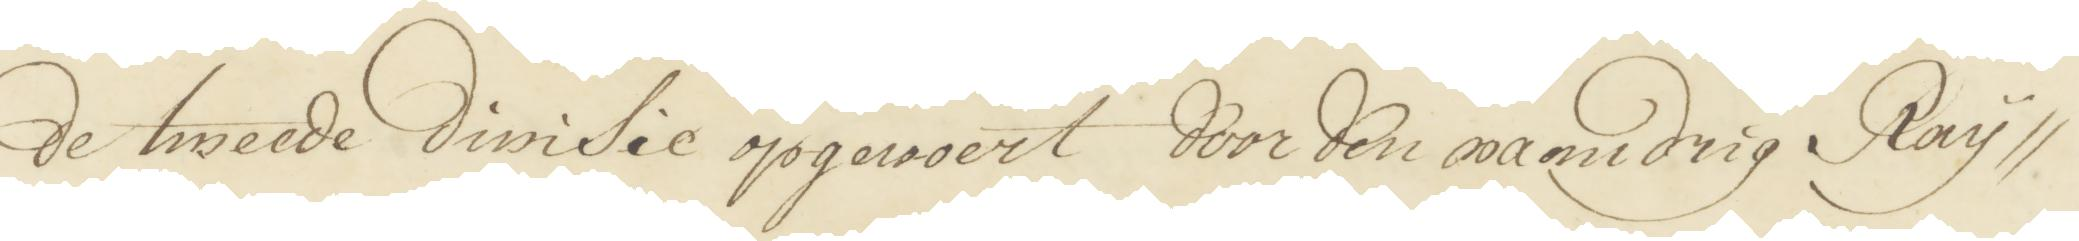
de tweede divisie opgevoert door den vaandrig Raij„
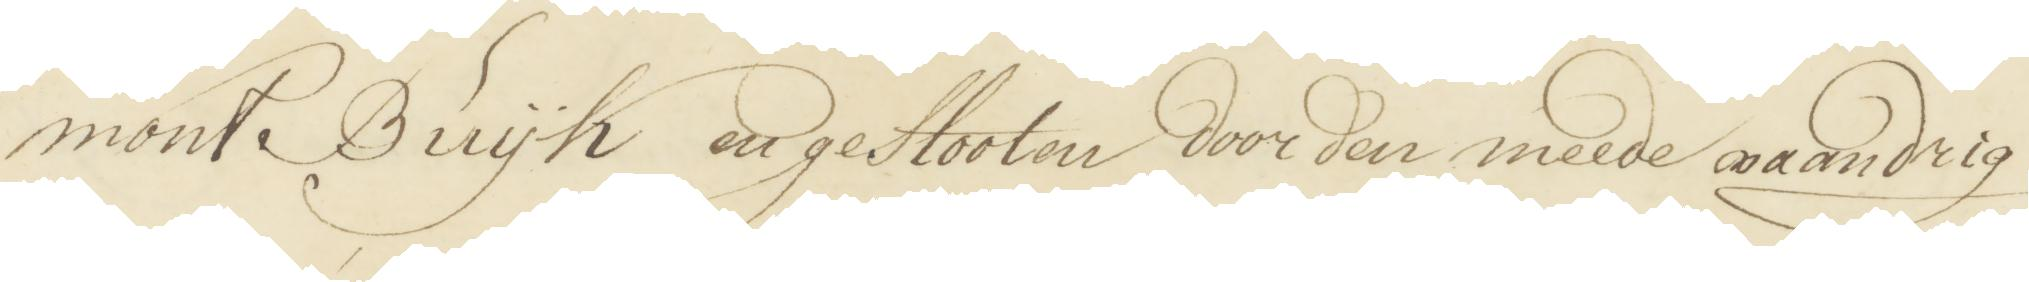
mont: Buijk en geslooten door den meede vaandrig
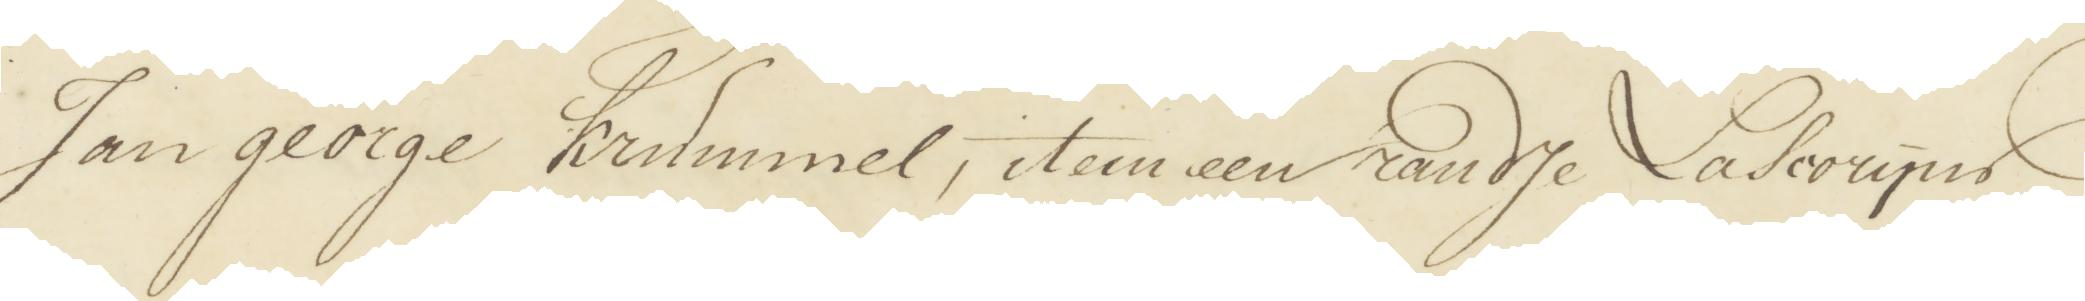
Jan george krummel, item een randje Lascorijns
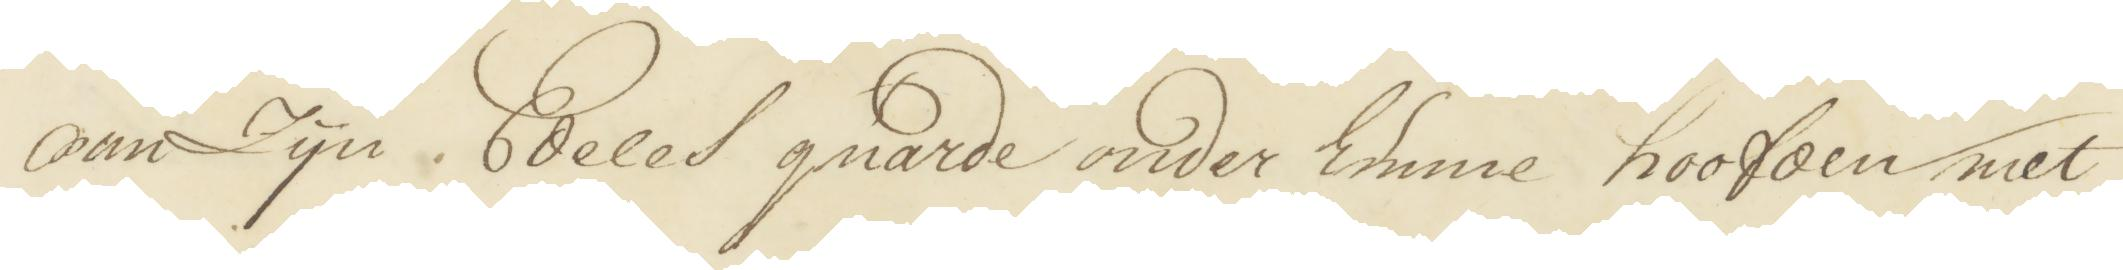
van zijn Edeles guarde onder hunne hoofden met
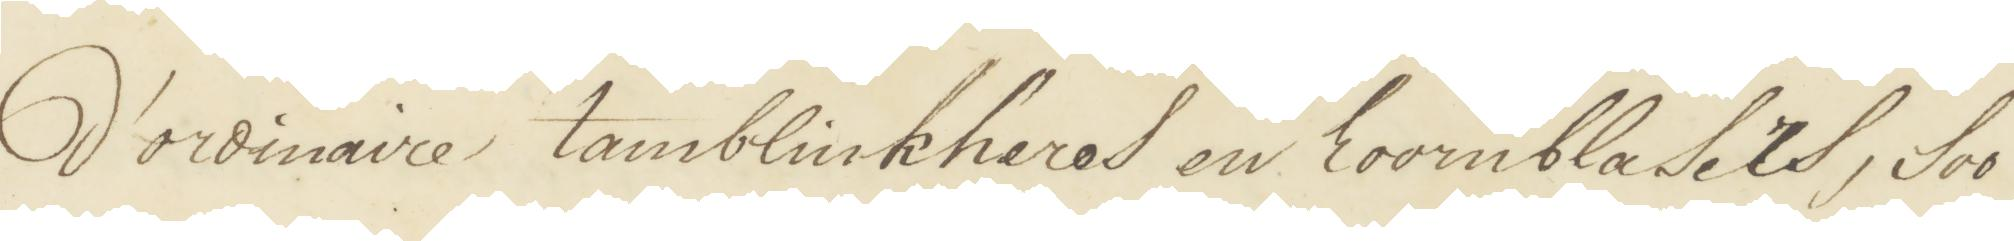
d’ordinaire tamblinkheros en hoornblasers, soo
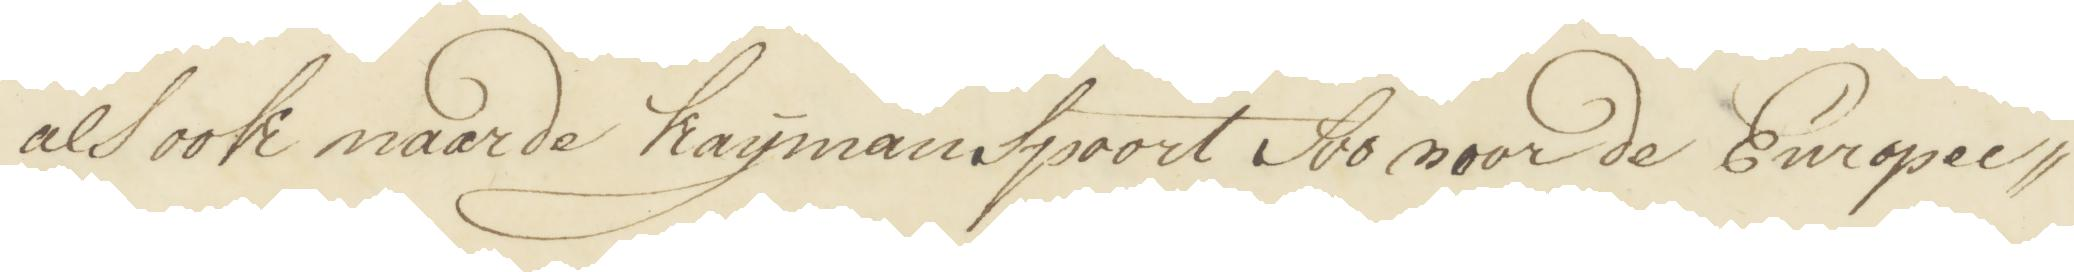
als ook naar de kaijmanspoort soo voor de Europee„
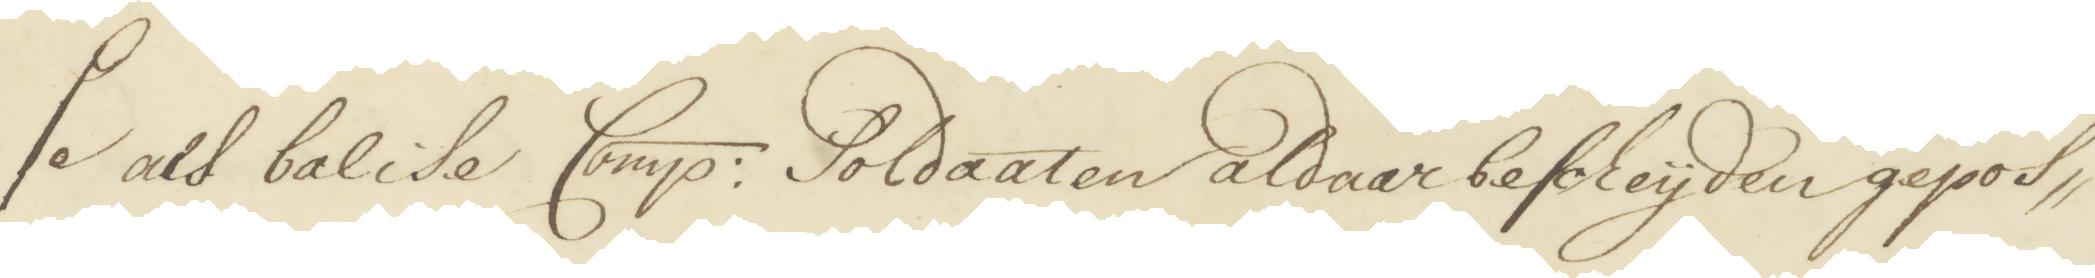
se als balise Comp: soldaaten aldaar bescheijden gepos„
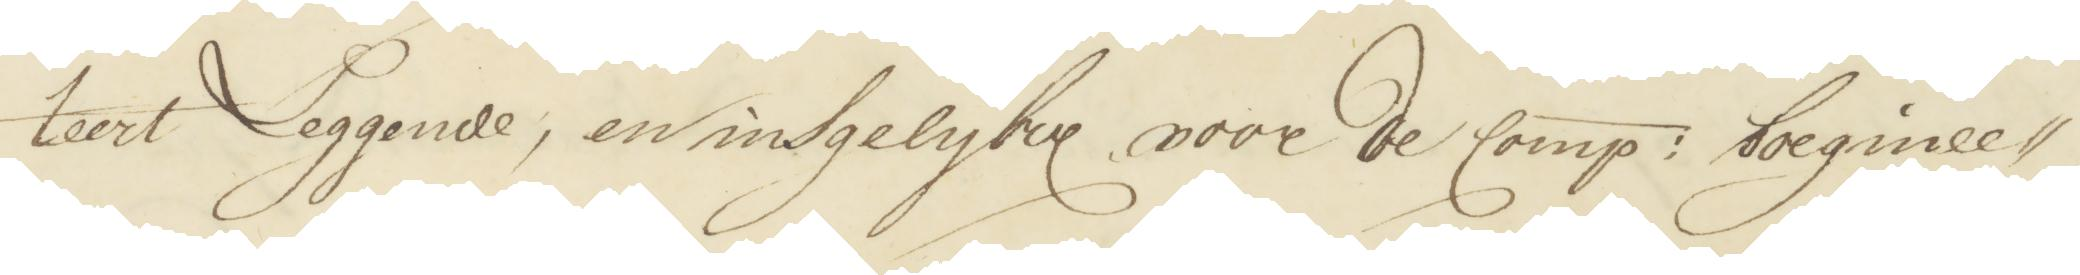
teert Leggende, en insgelijkx voor de Comp: boeginee„
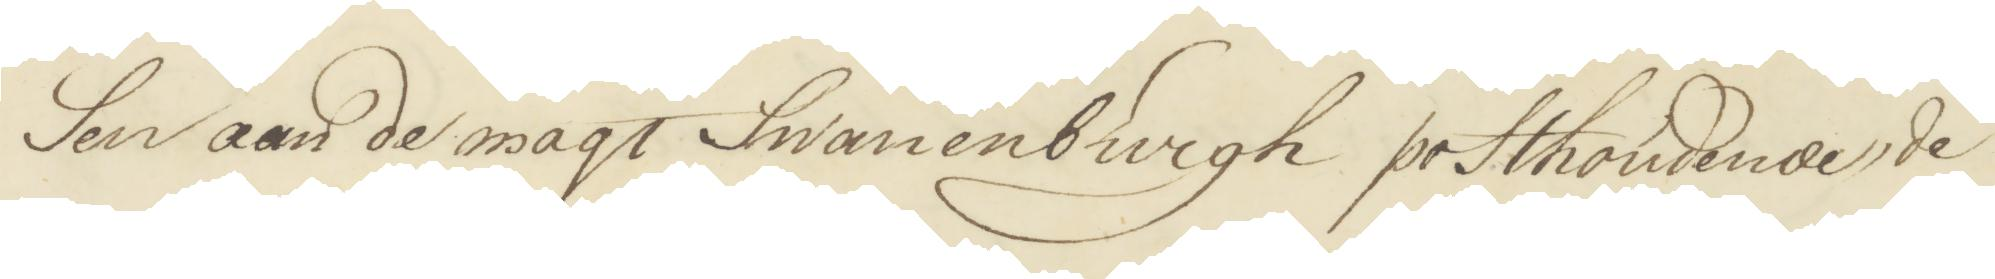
sen aan de magt swanenburgh posthoudende, de
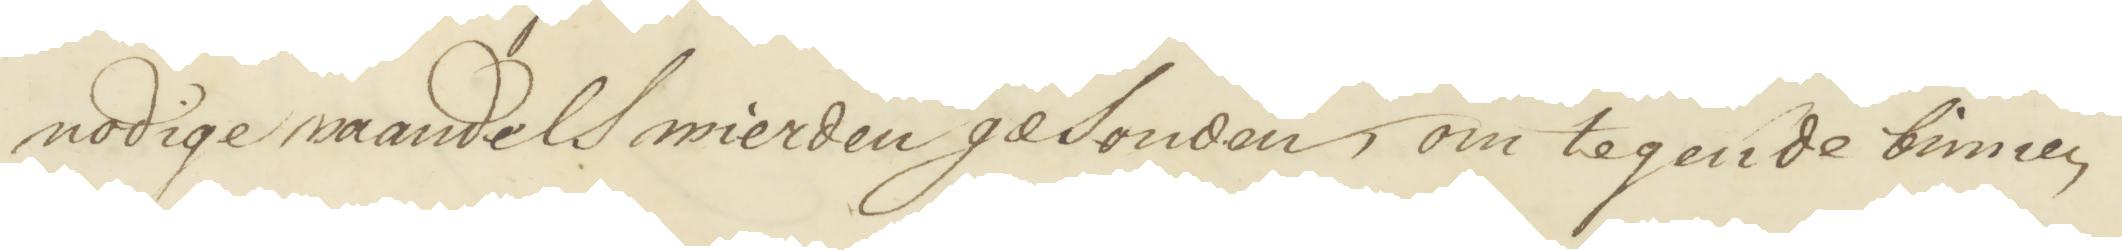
nodige vaandels wierden gesonden, om tegen de binnen
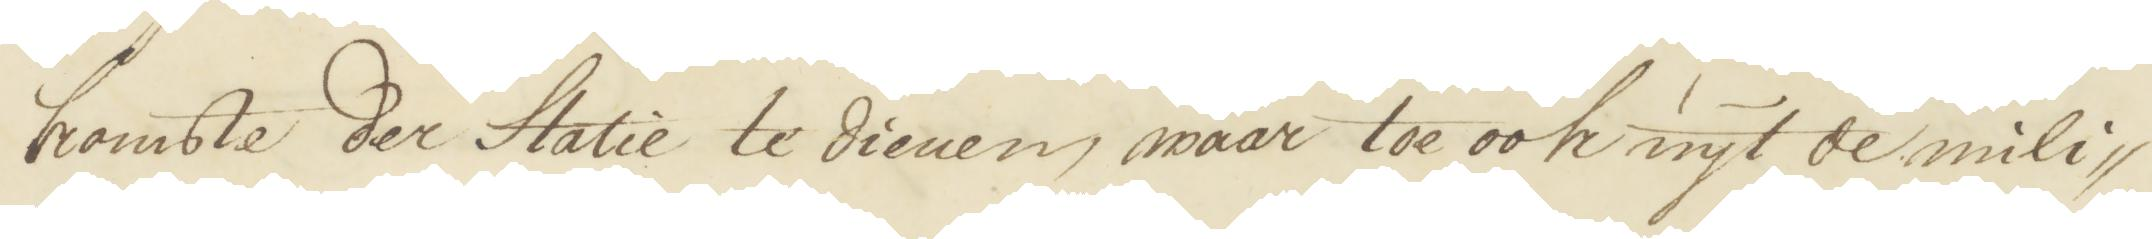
komste der statie te dienen, waar toe ook uijt de mili„
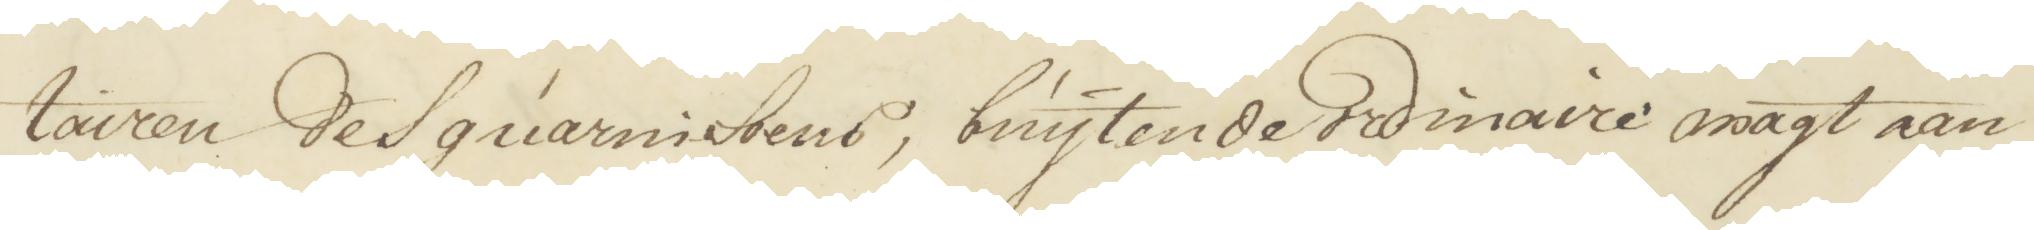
tairen des guarnisoens, buijten de ordinaire wagt aan
